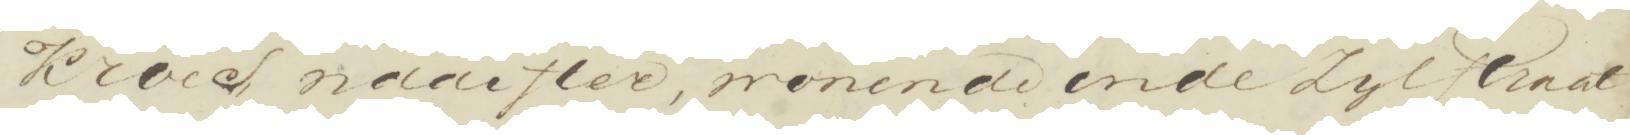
Kroes, naaister, wonende inde Zylstraat
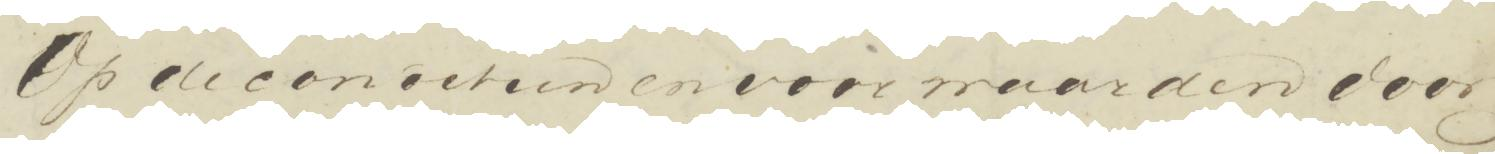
Op de conditien en voor waarden door
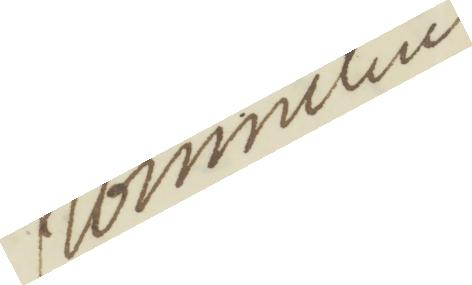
Cromnelin
